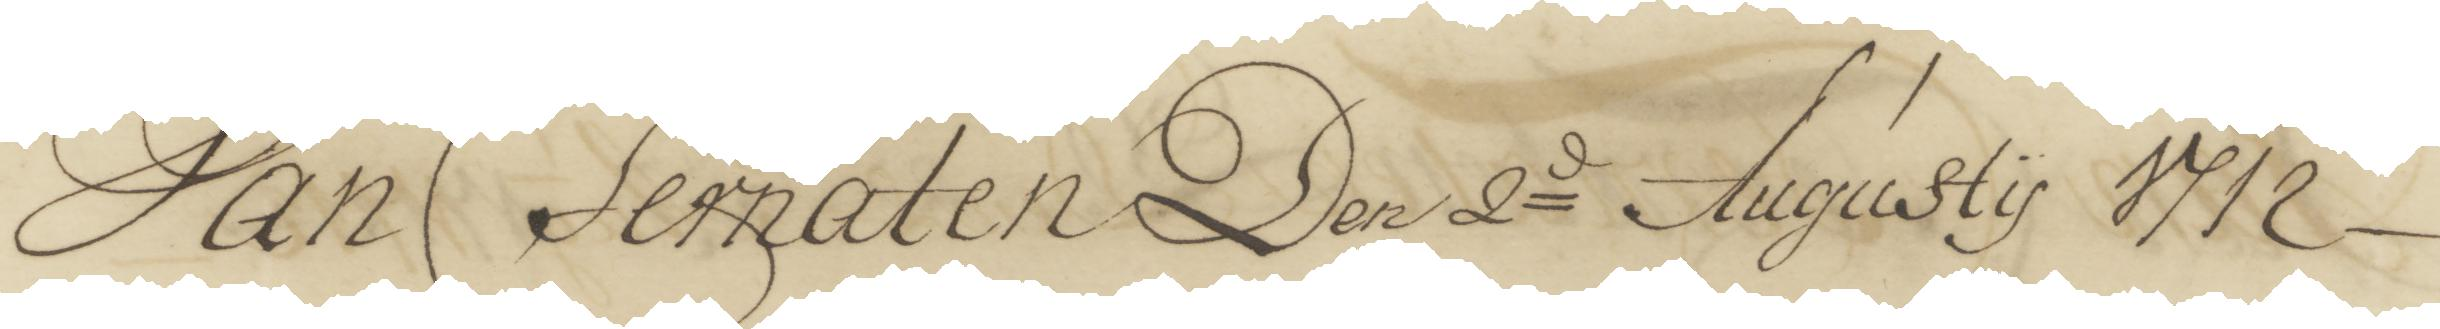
Van Ternaten Den 2=e Augustij 1712—
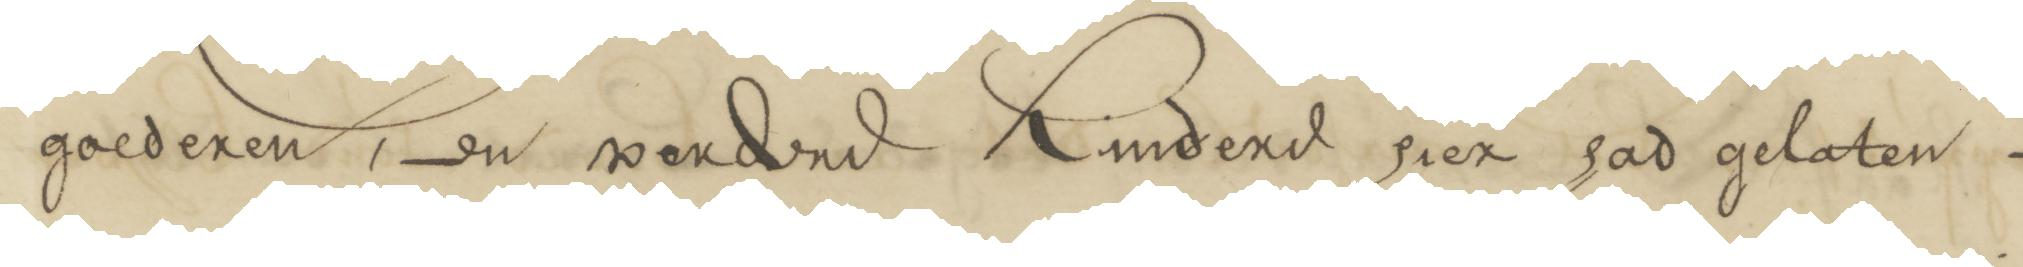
goederen, en verdere kindere hier had gelaten
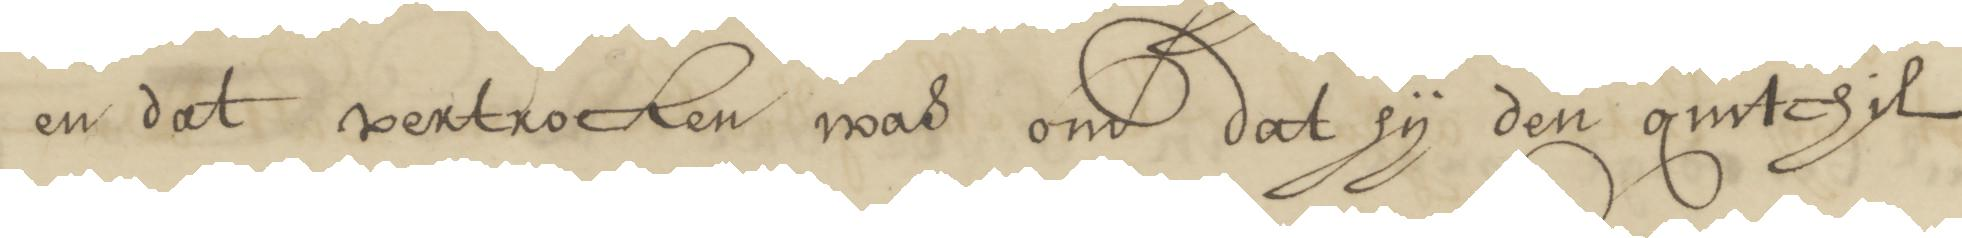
en dat vertrocken was om dat hij den quitchil
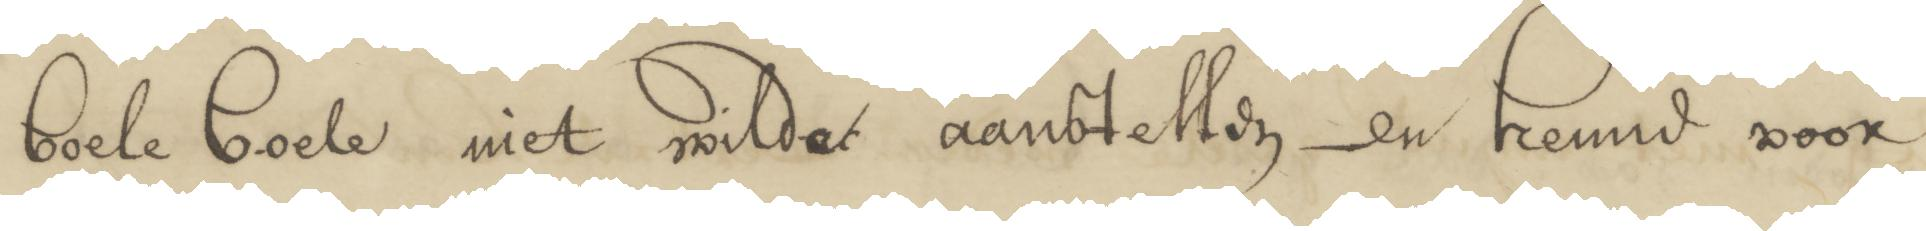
boele boele niet wilde aanstellen en kenne voor
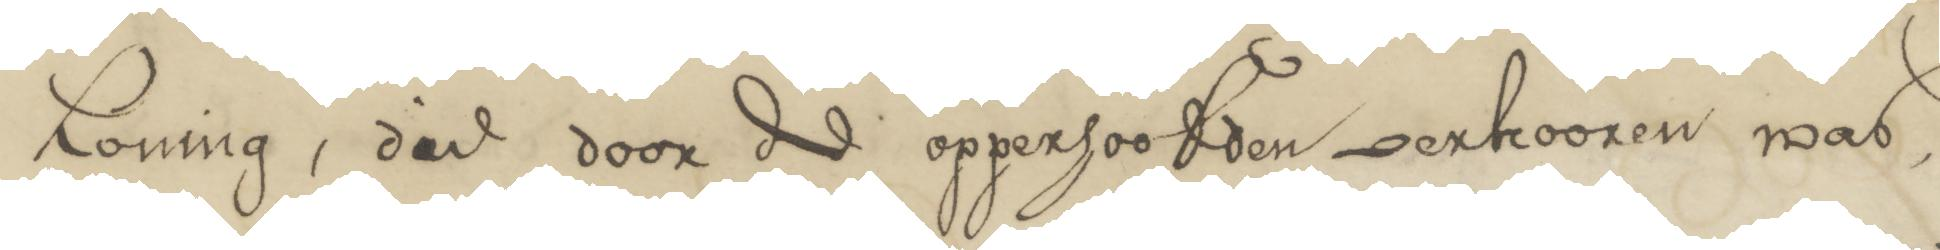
koning, die door de opperhoofden verkooren was,
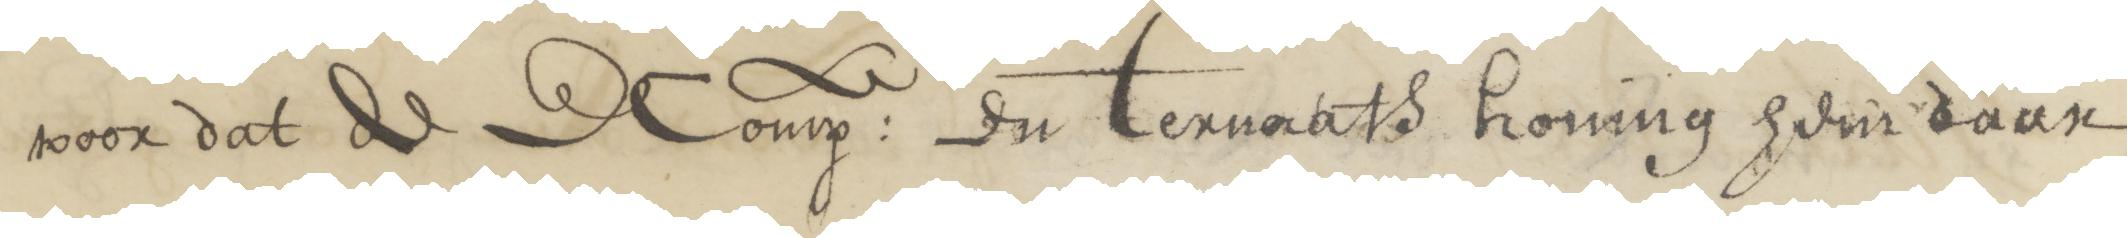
voor dat de EComp: en ternaats koning hem daar
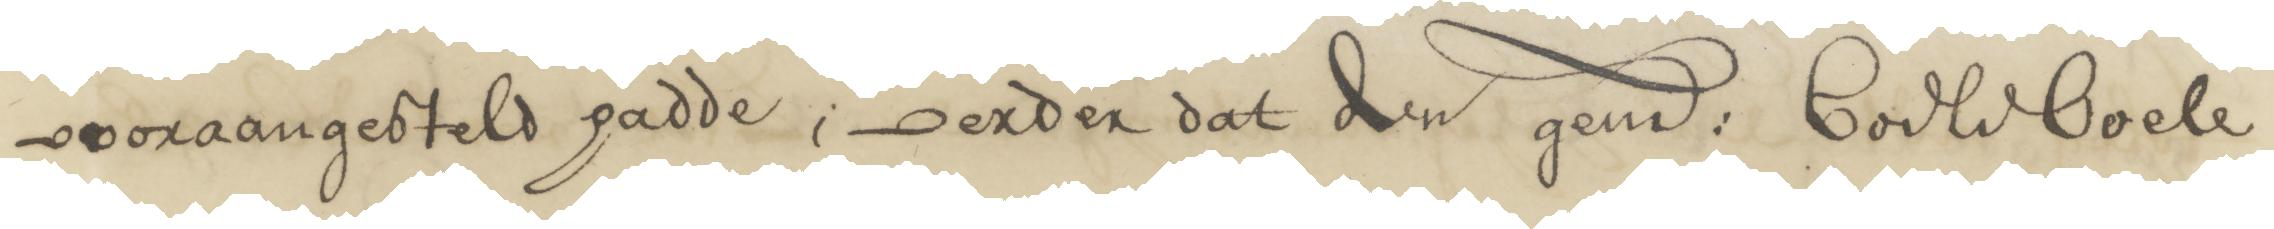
voor aangesteld hadde; verder dat den gem: boele boele
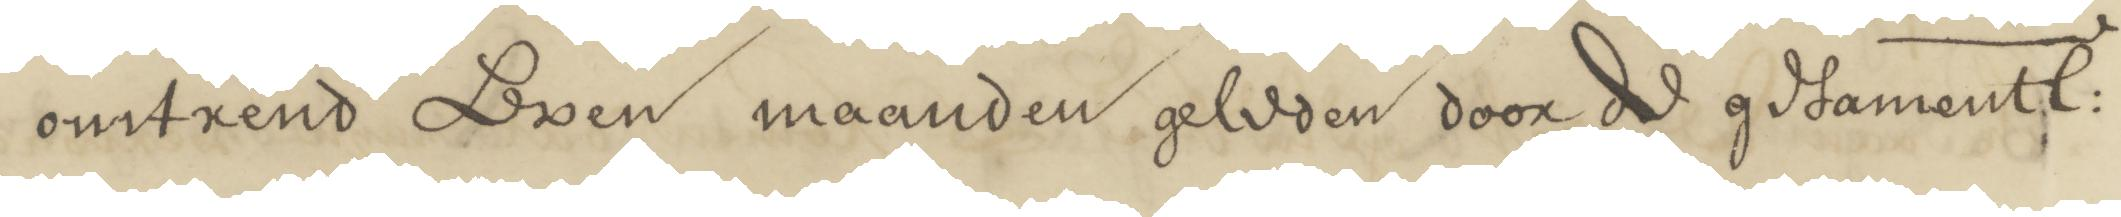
omtrend Seven maanden geleden door de gesamentl:e
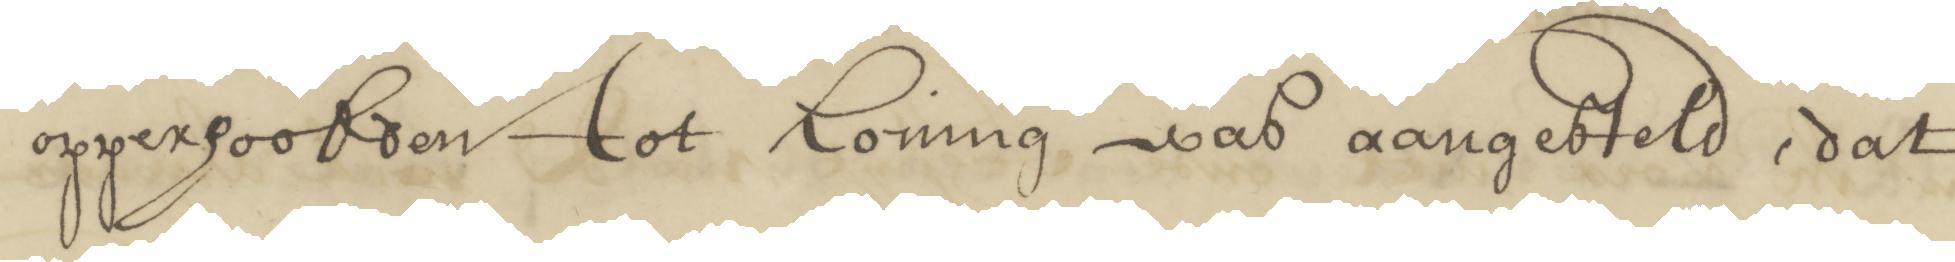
opperhoofden tot koning was aangesteld, dat
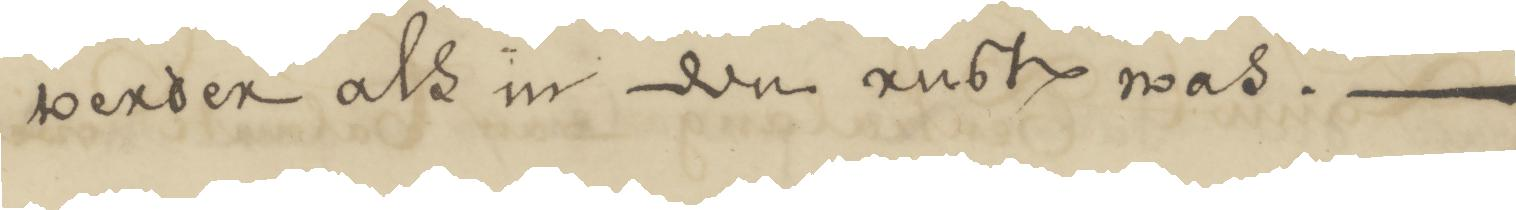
verder als in een ruste was.
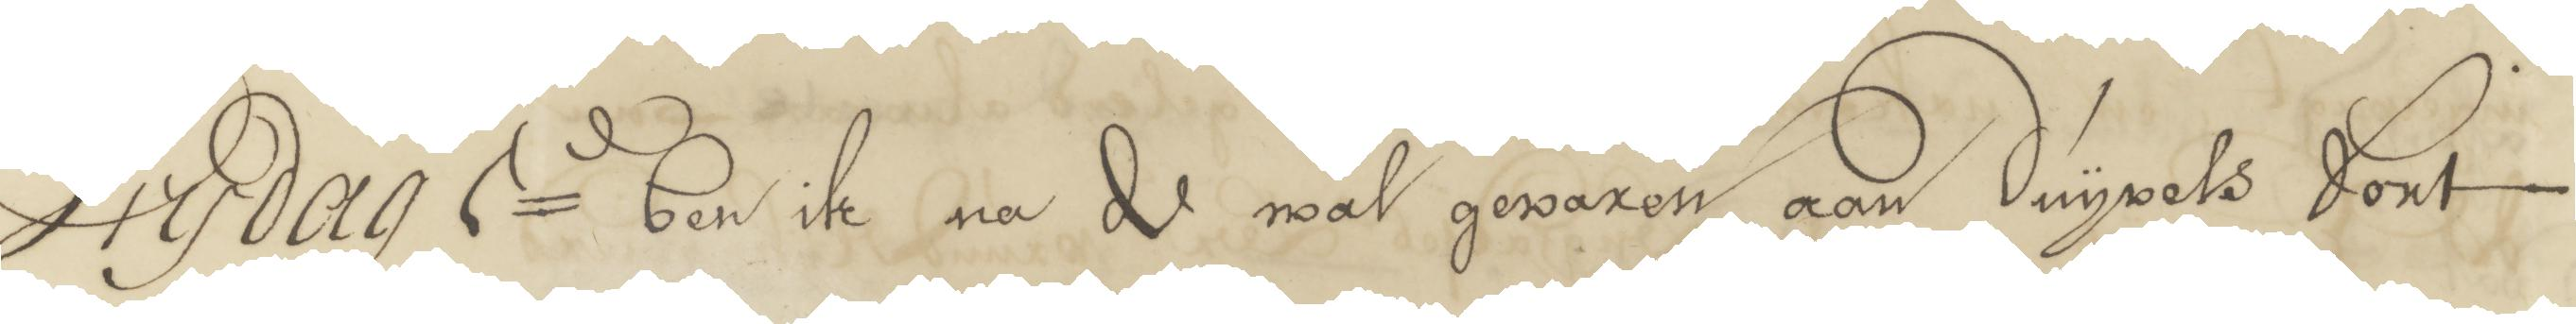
Vrydag 5=e ben ik na de wal gevaren aan duijvels fort
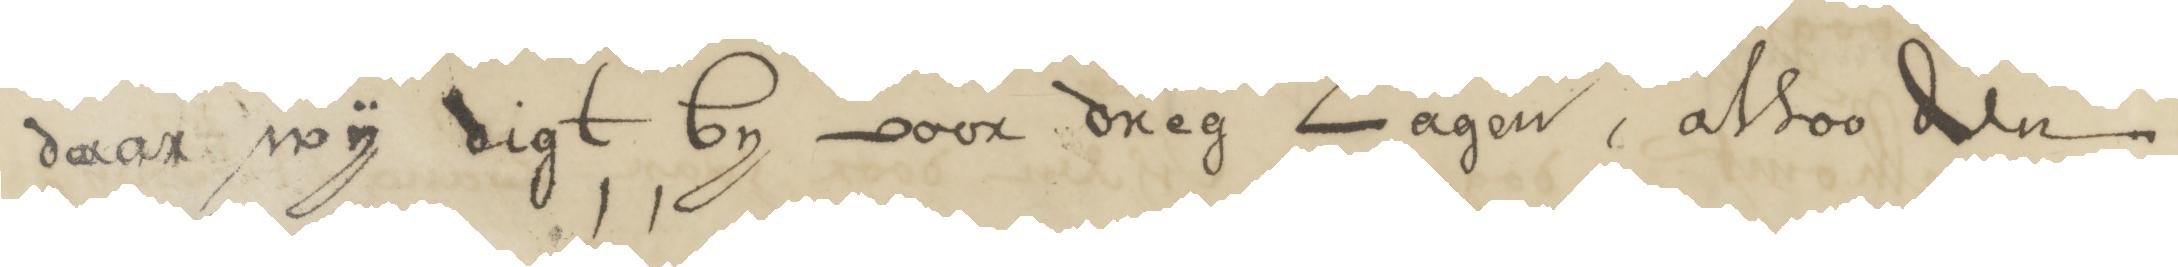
daar wij digt by voor dreg Lagen, alsoo den
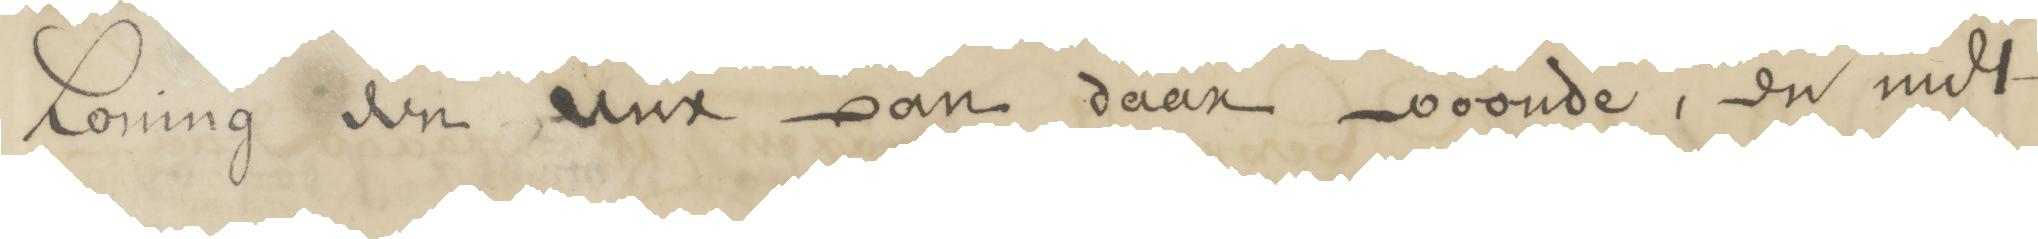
koning een uur van daar woonde, en niet
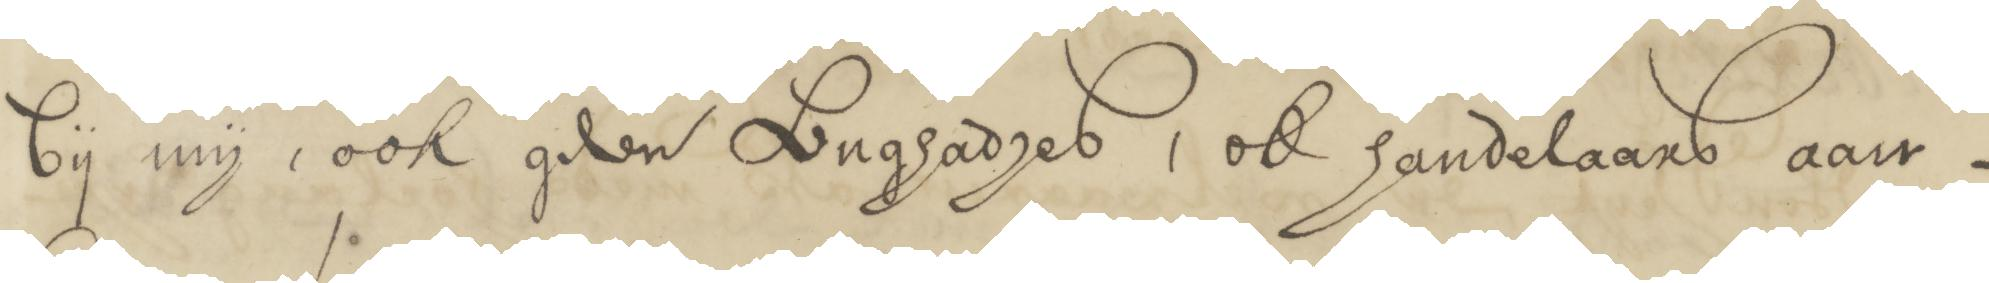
bij mij, ook geen Senghadjes, of handelaars aan
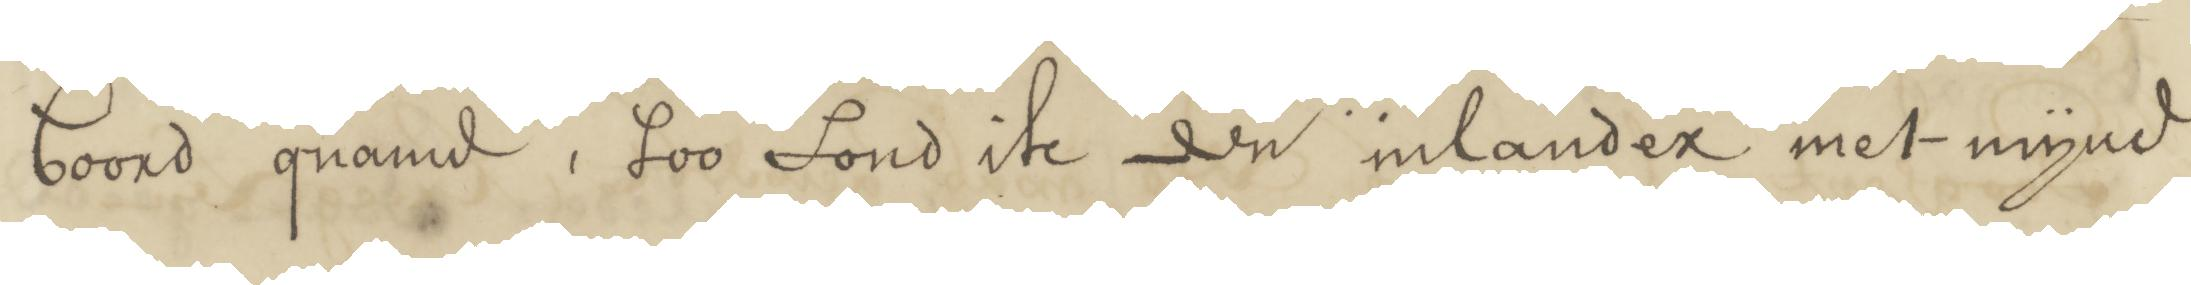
boord quame, Soo Sond ik een inlander met mijne
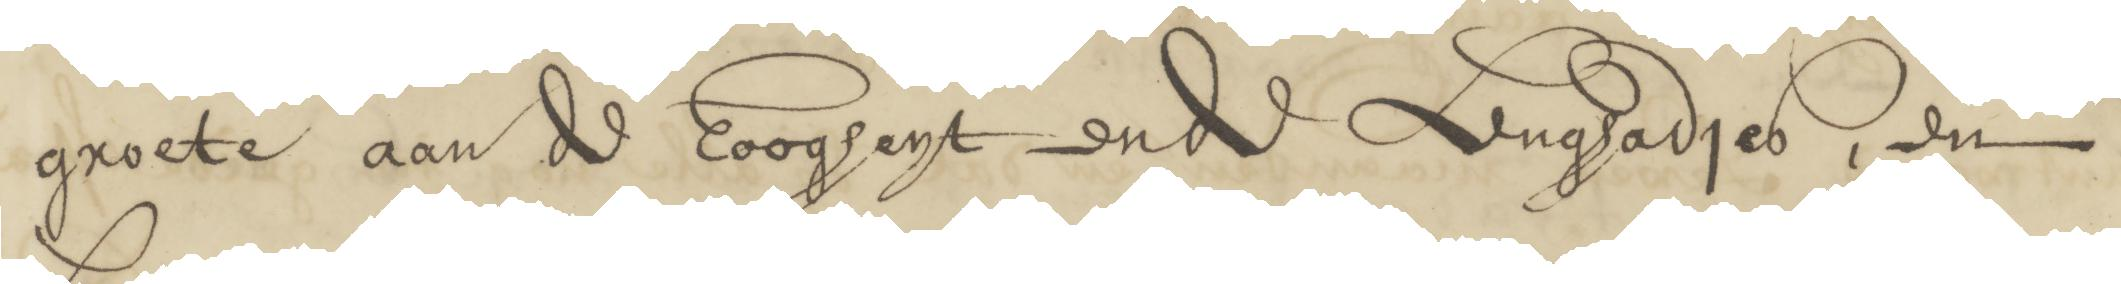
groete aan de hoogheyt ende Senghadjes, en
